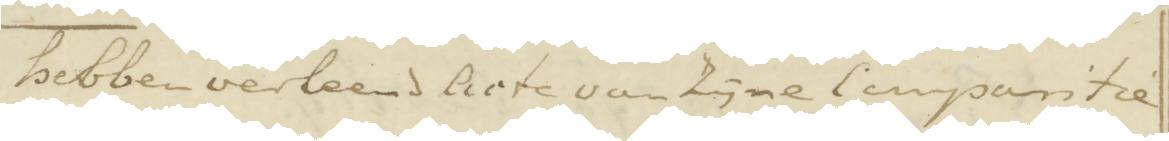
hebben verleend Acte van Zijne Comparitie
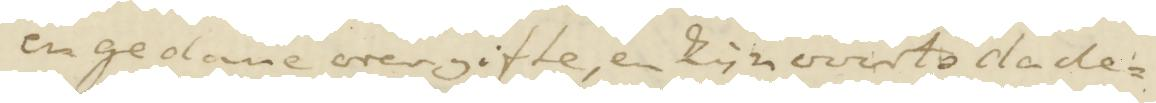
en gedane overgifte, en Zijn voorts dade=
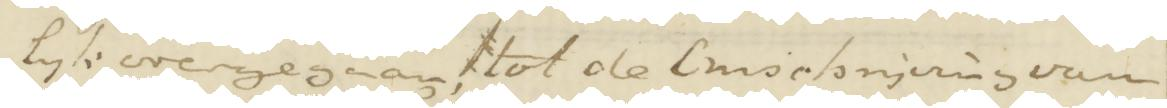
=lyk overgegaan, tot de Omschrijving van
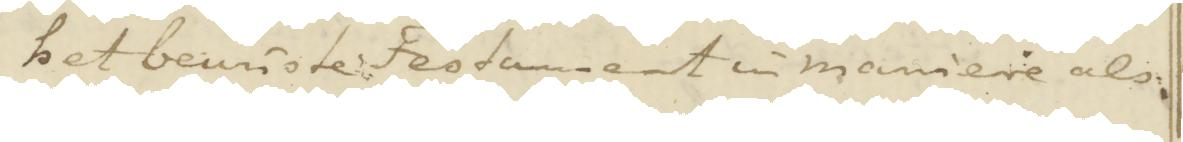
het bewuste Testament in maniere als
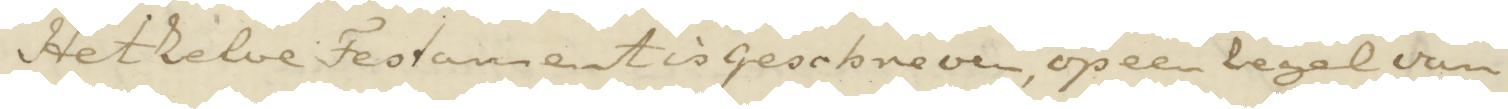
Het Zelve Testament is geschreven, op een zegel van
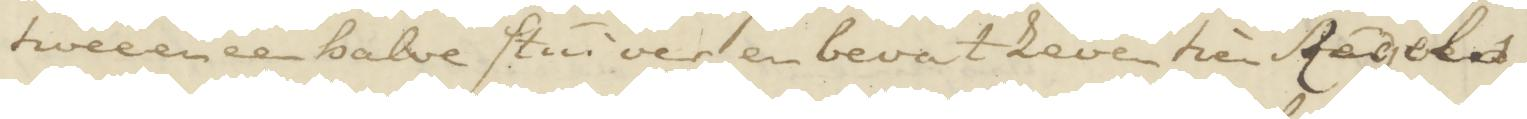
twee en een halve Stuiver, en bevat Zeventien Regels,
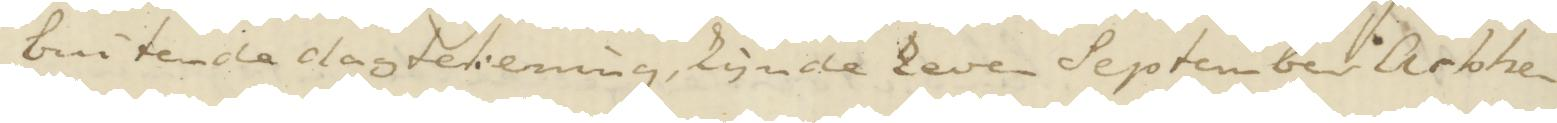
buiten de dagtekening, Zijnde Zeven September Achtien
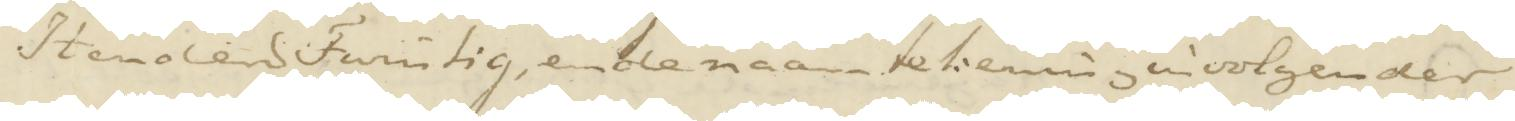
Honderd Twintig, en de naam tekening in volgender
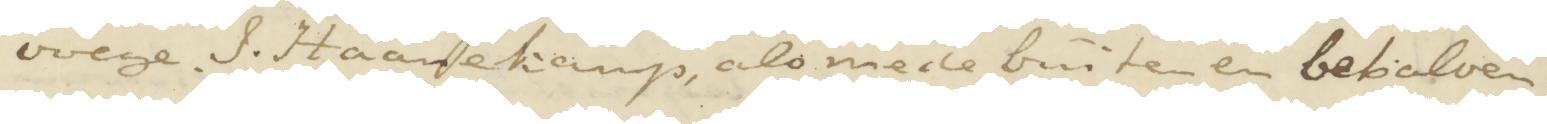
wege. I. Haanekamp, als mede buiten en behalven
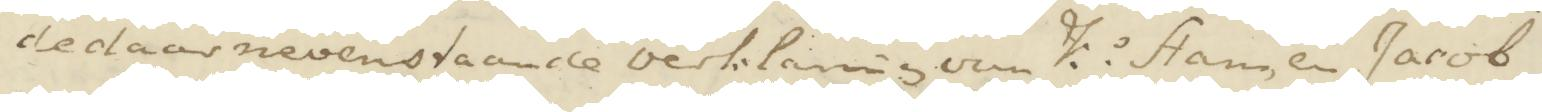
de daar nevenstaande verklaring van K. Stam, en Jacob
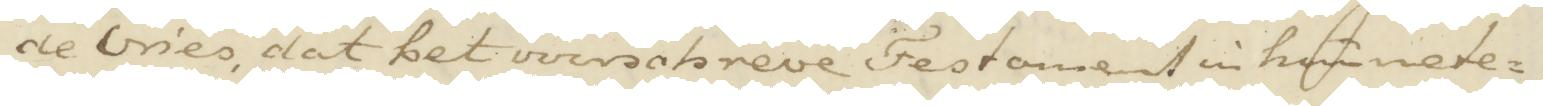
de Vries, dat het voorschreve Testament in hunne te=
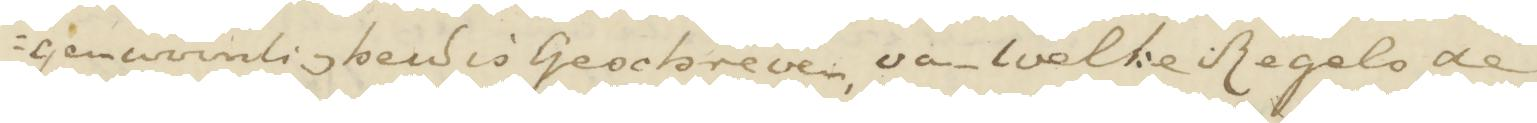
=genwoordigheid is Geschreven, van welke Regels de
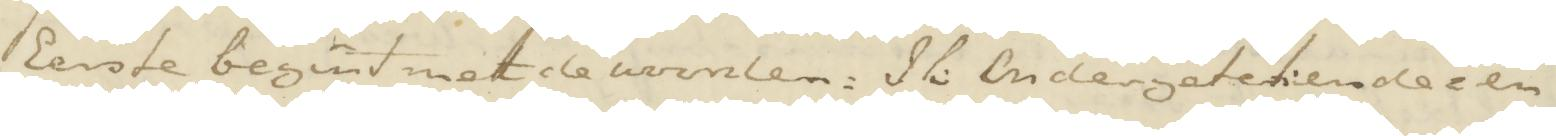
Eerste begint met de woorden = Ik Ondergetekende = en
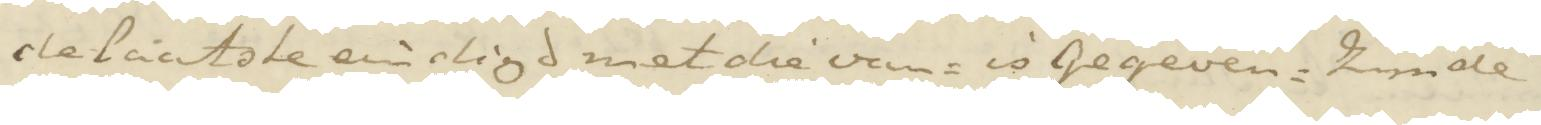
de laatste eindigd met die van = is gegeven = Zynde
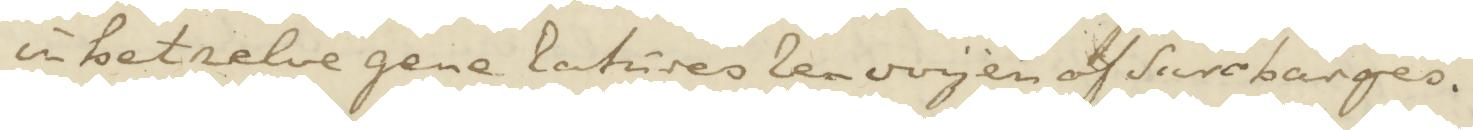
in het zelve gene Ratures Renvoijen of surcharges.
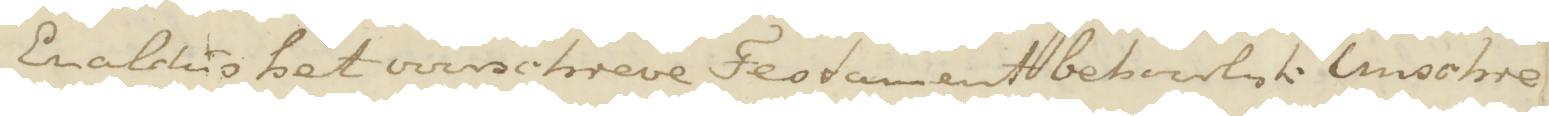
En aldus het voorschreve Testament behoorlyk Omschre
